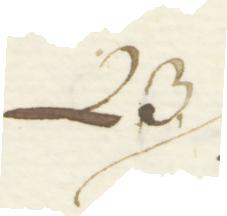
23./.
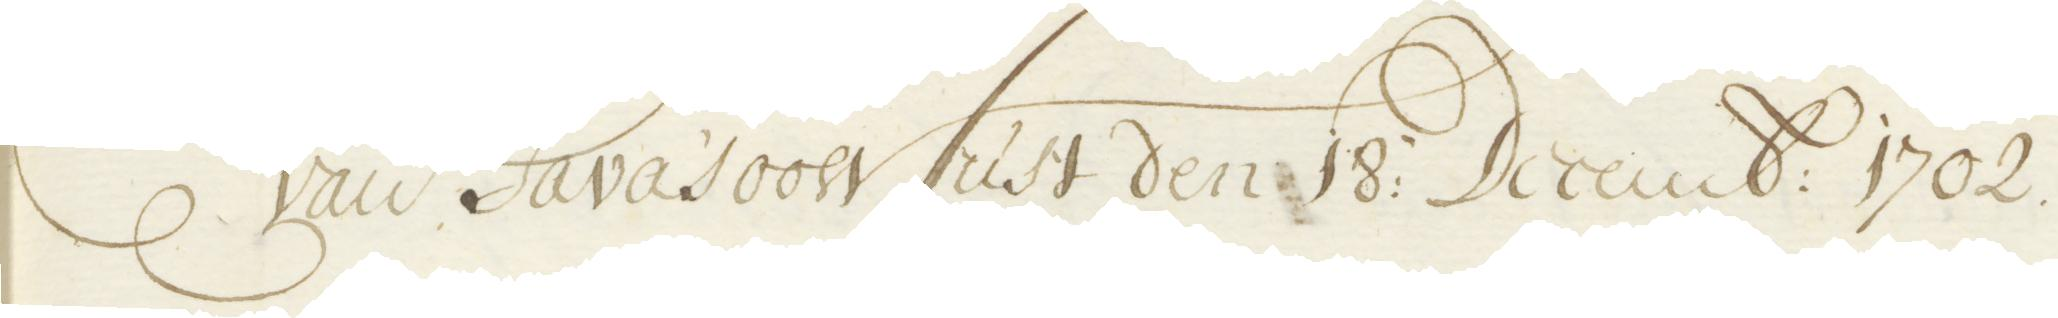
Van Iava 's oost Cust den 18:' Decemb: 1702.
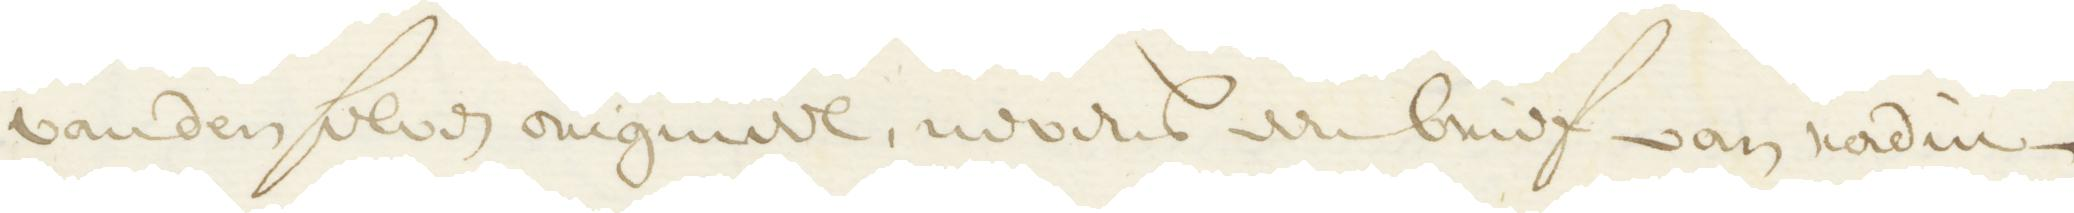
van den selven origineel, nevens een brief van radin
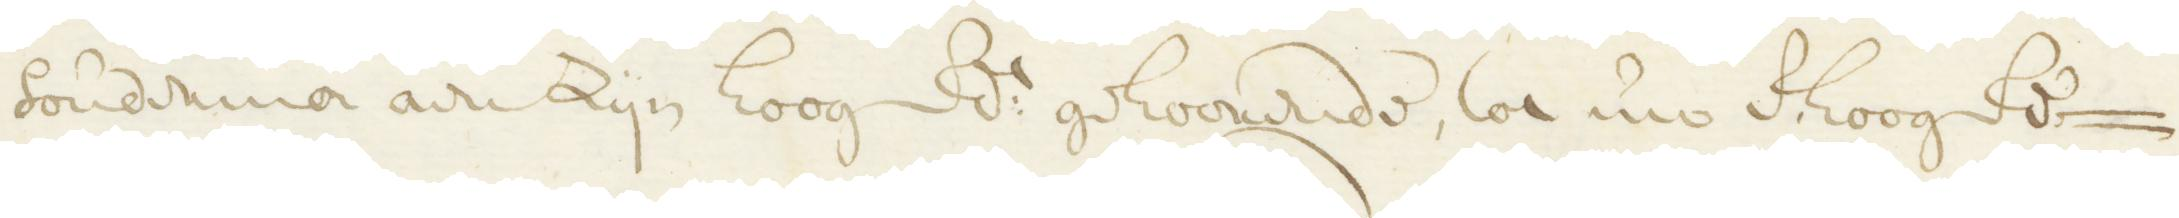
souderma aen zijn hoog Ed:t gehoorende, tot uw E. hoog Ed=
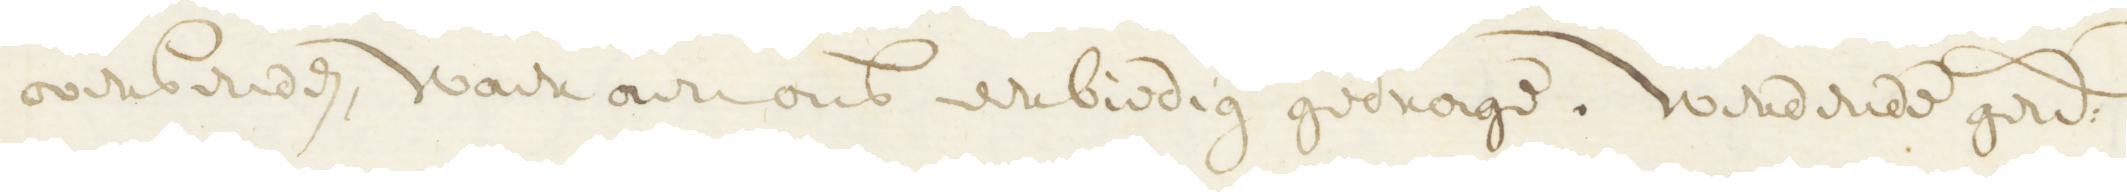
oversenden, waer aen ons eerbiedig gedrage, werdende gen:
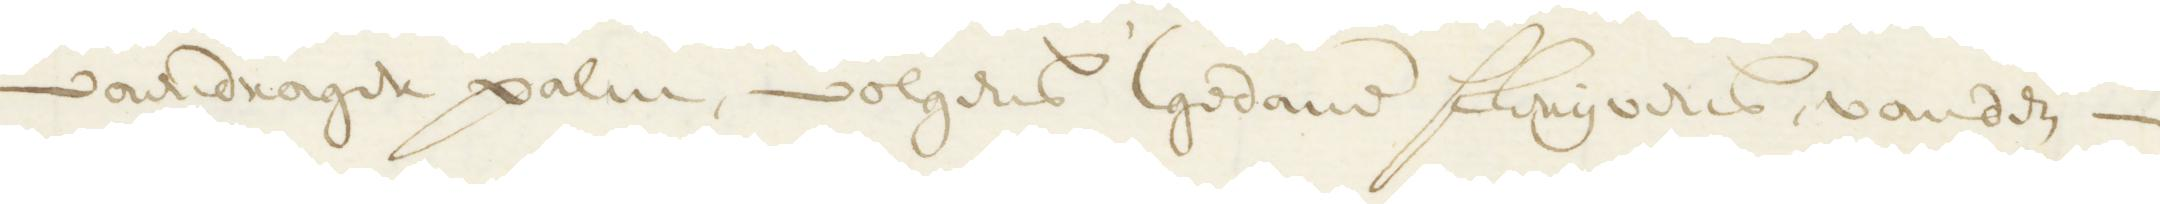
vaendrager palm, volgens 't gedane schrijvens, van den —
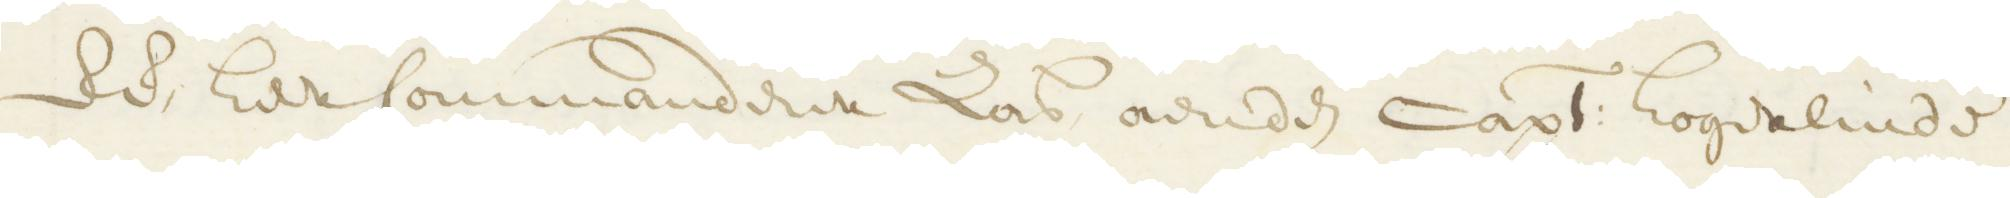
EE, heer Commandeur Zas, aen den Capt: hogerlinde
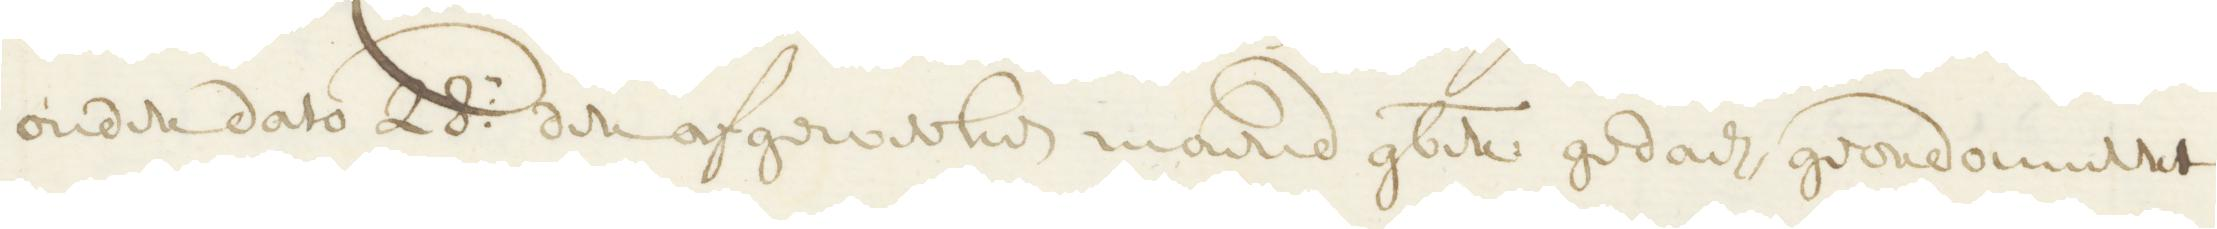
onder dato 28:' den afgeweeken maend gber: gedaen, geordonneert
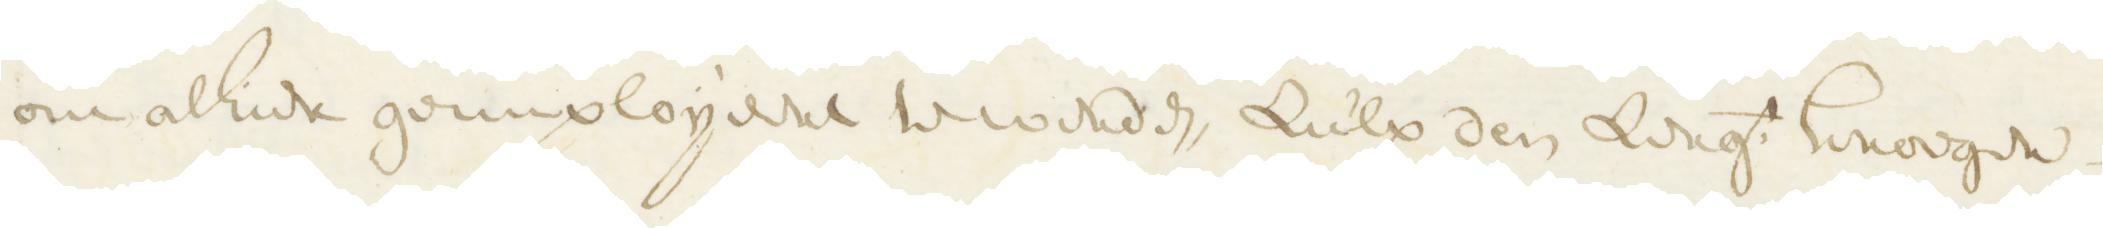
om alhier geimploijeert te werden, zulx den zerg:t kroeger
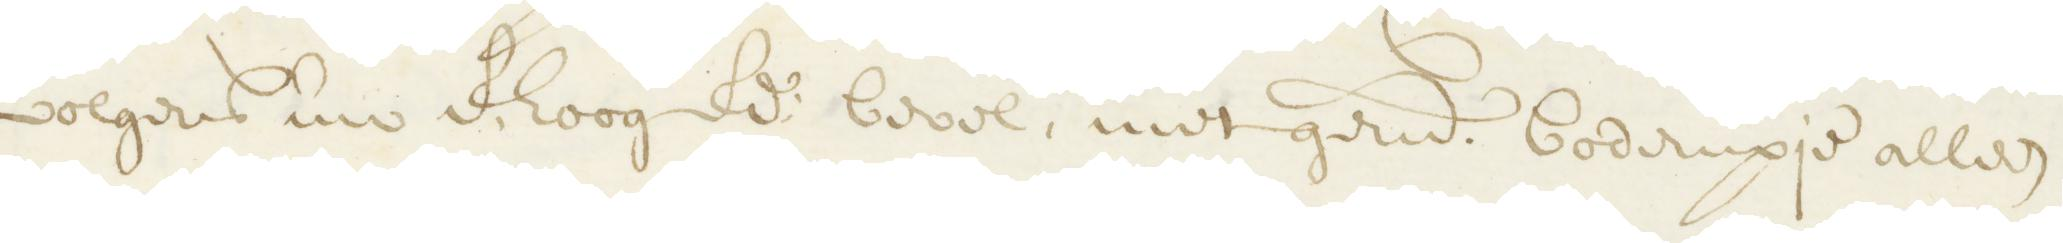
volgens uw E: hoog Ed: bevel, met gem. bodempje alleen
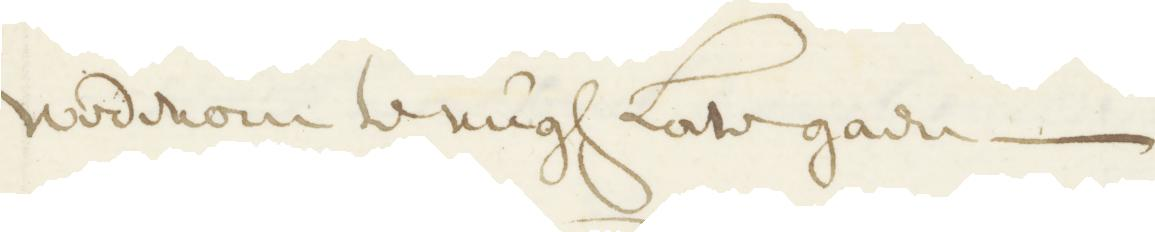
wederom terugh late gaen —.
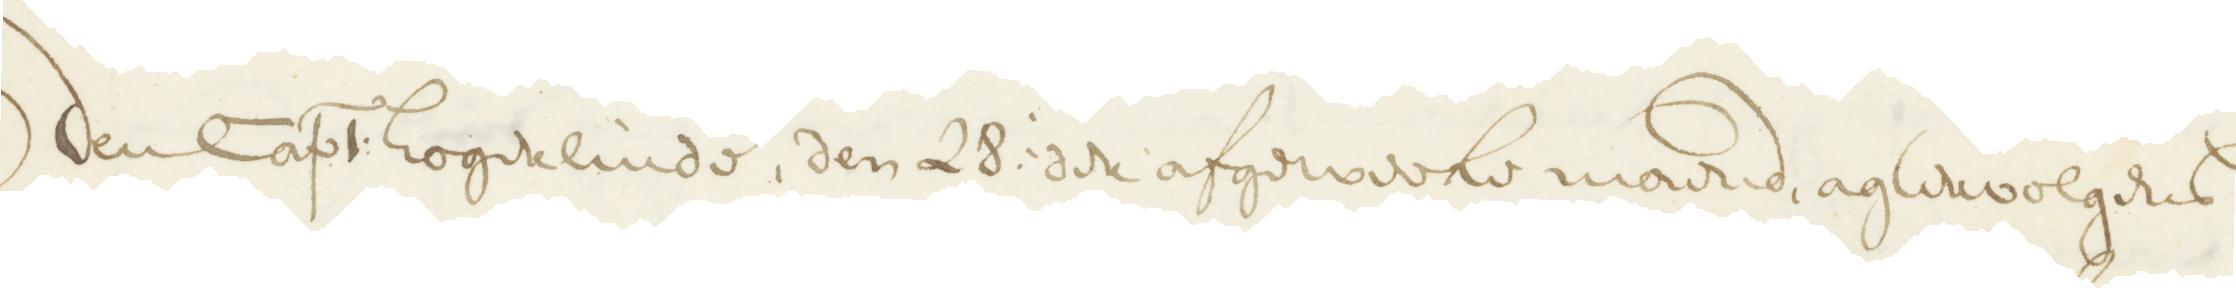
den Capt: hogerlinde, den 28: der afgeweeke maend, agtervolgens
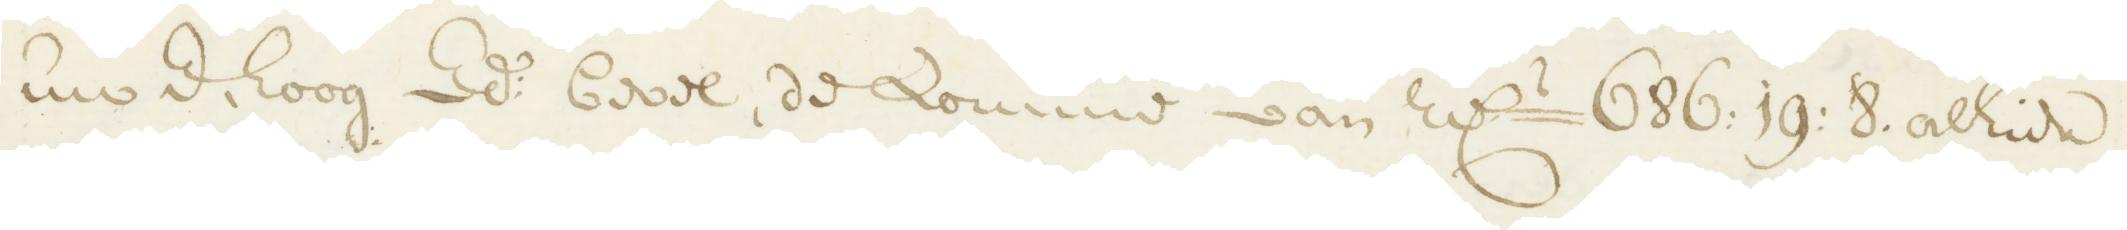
uw E: hoog Ed: bevel, de zomme van rx=s 686:19: 8. alhier
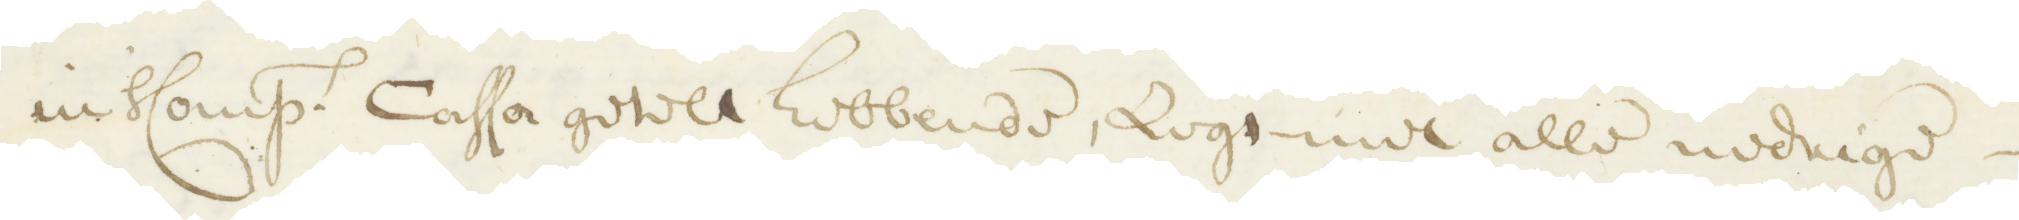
in 'sComp.s Cassa getelt hebbende, zegt met alle nedrige
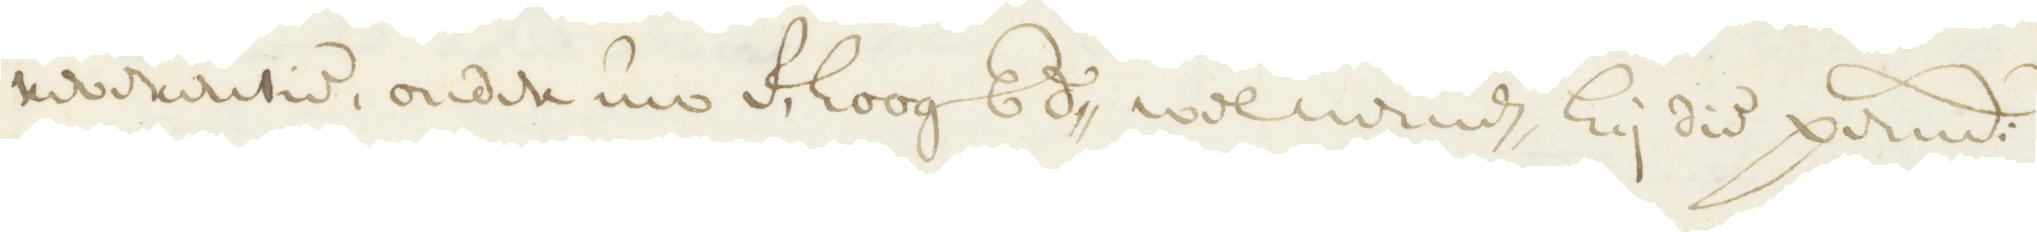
reverentie, onder uw E. hoog Ed„ welnemen, hij die penn:
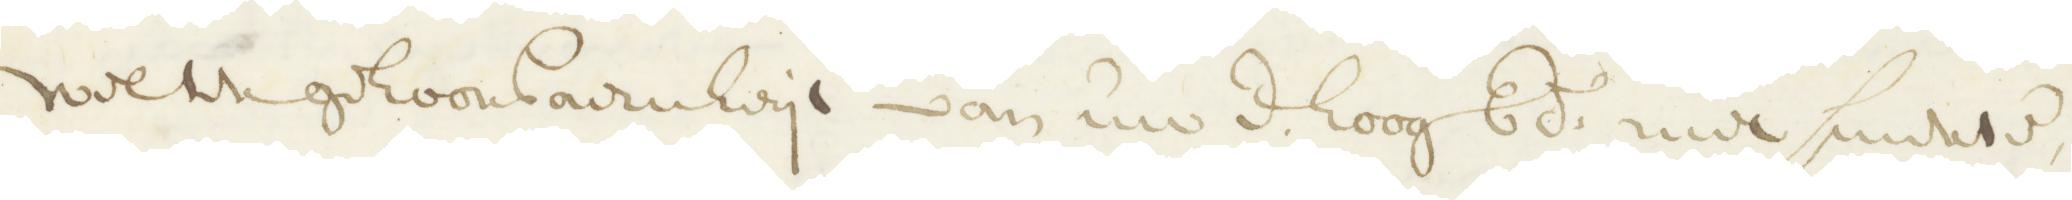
welter gehoorsaemheijt van uw E. hoog Ed: met smerte,
